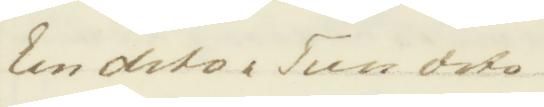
Een dito & Tien dito
